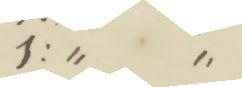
1: „ „
